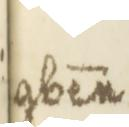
9ber
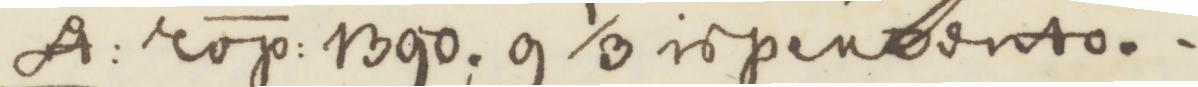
st: rop 1390. 9 1/3 is percento .
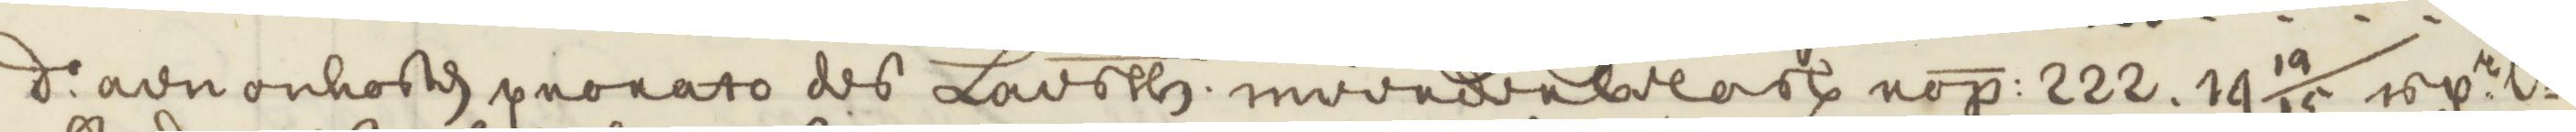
d.o aen onkosten prorato des Laestlijk meerderbelast rop: 222. 14 14/15 is p„r C=to
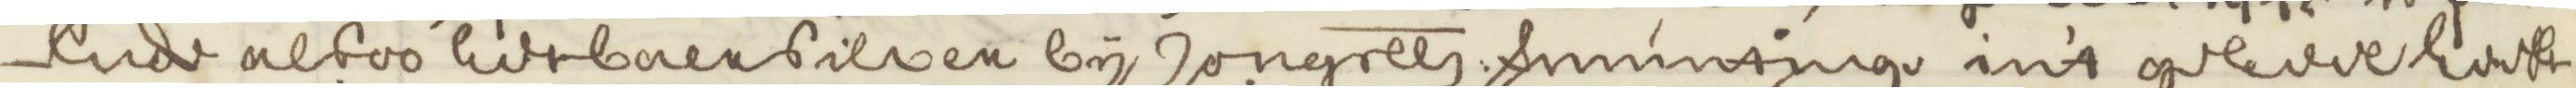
Ende alsoo het baersilver bij jongstlijk vermuntinge in’t geheel heeft
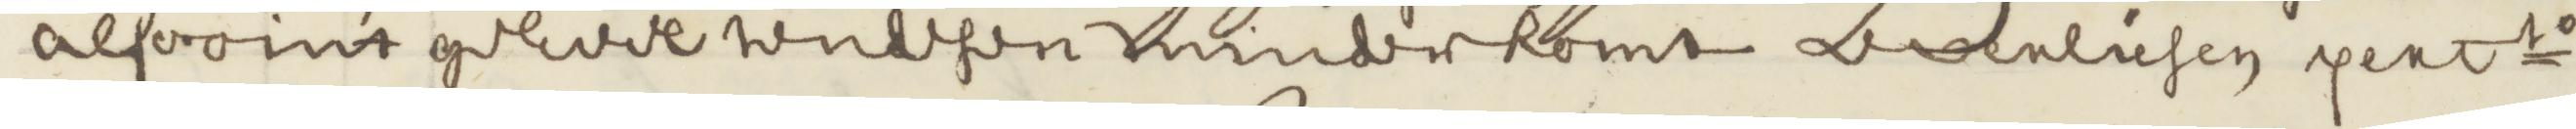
alsoo in't geheel ten desen minderkomt te verliesen perc=to
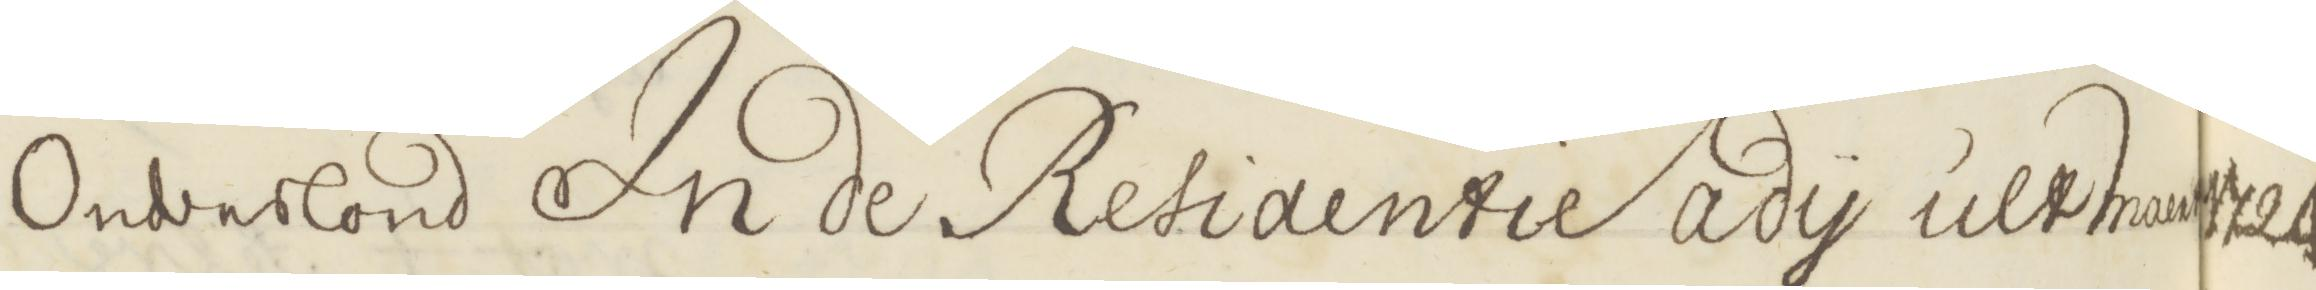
Onderstond In de Residentie adij ult maart 1724
